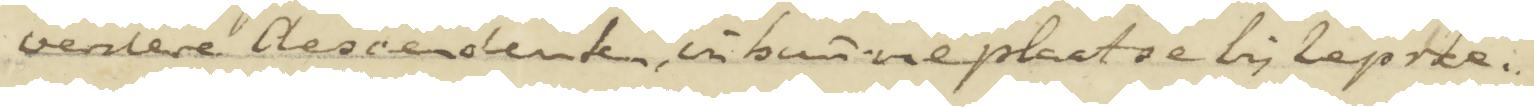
verdere descendenten, in hunne plaatse bij repre„
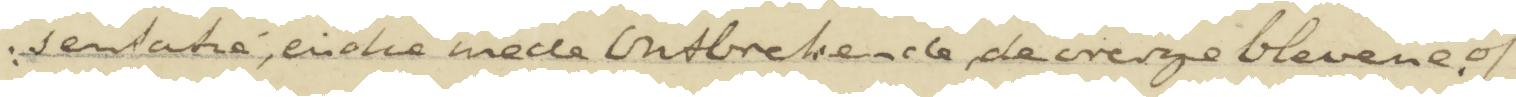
sentatie, en die mede ontbrekende, de overgeblevene, of
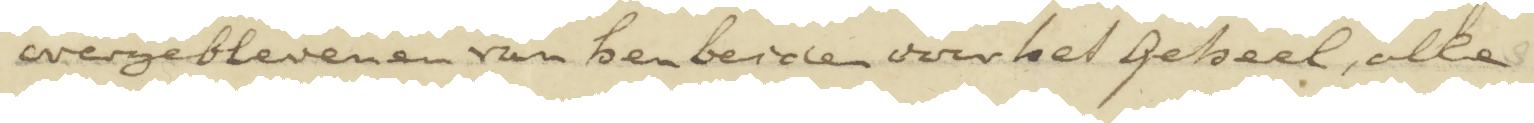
overgeblevenen van hen beiden over het geheel, alle
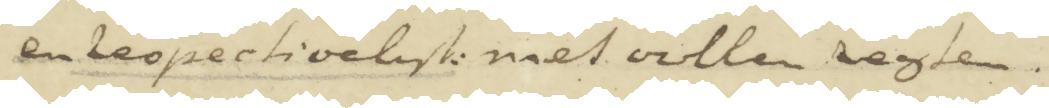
en respectivelyk met vollen regten.
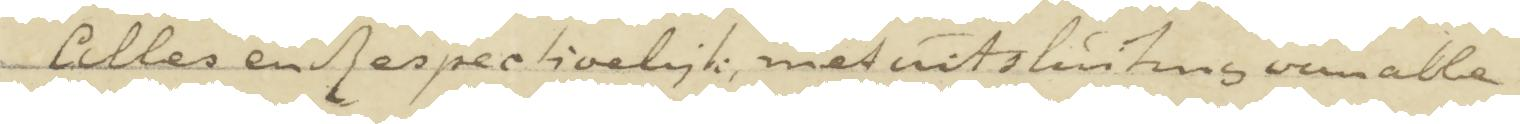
Alles en Respectivelijk, met uitsluiting van alle
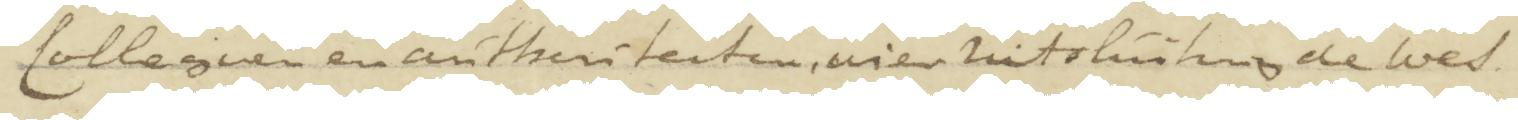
Collegien en authoriteiten, wier uitsluiting de wes.
